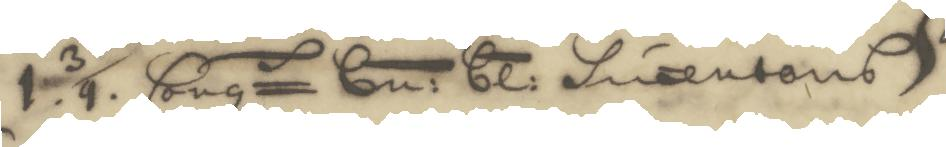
1. ¾. Corg=s br: bl: Sucertons }
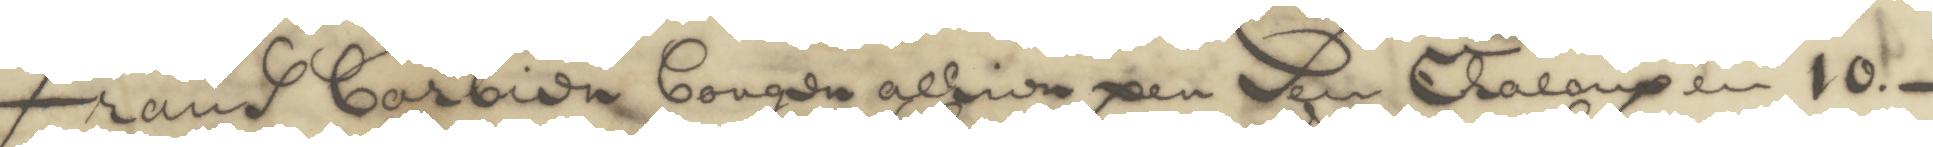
Frans barbier borger alhier per Een Chaloup en 10.–
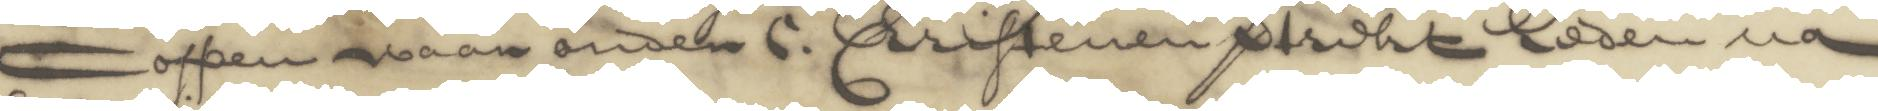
Coppen waar onder 5. Christenen vertrekt heden na
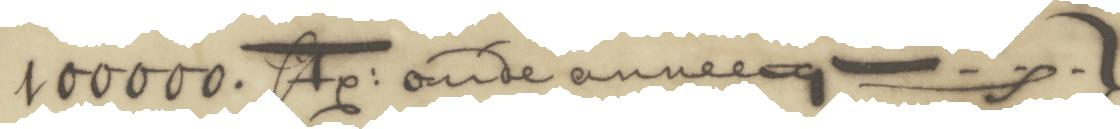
100000. stx: oude arreecq — - - - }
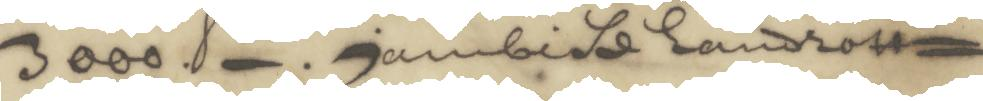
3000. —. Jambise handrott
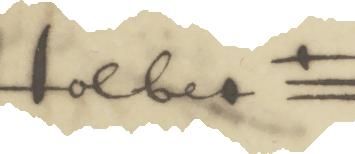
} tolbet=t
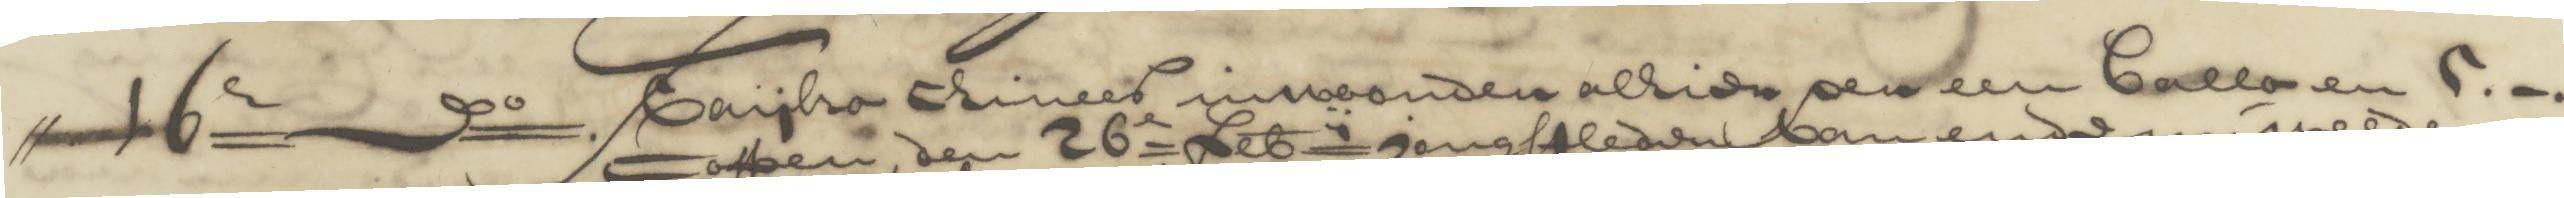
„ 16=en D:o Faijko Chinees inwoonder alhier per een ballo en 5.-.
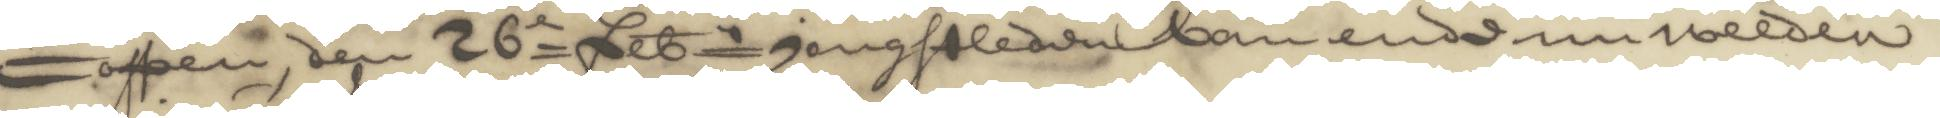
Coppen, den 26=e feb=ij jongstleden van ende nu weeder
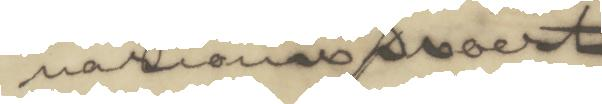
na riouw vervoert
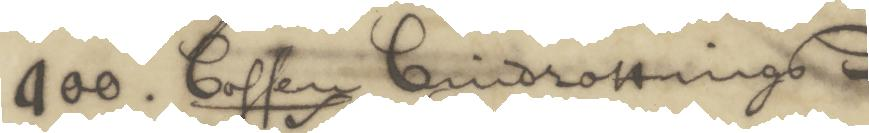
400. bossen bindrottings
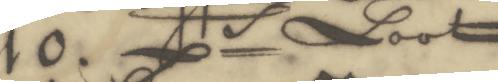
10. p=s Loot
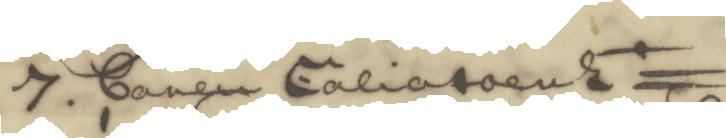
7. baren Caliatoerh=t
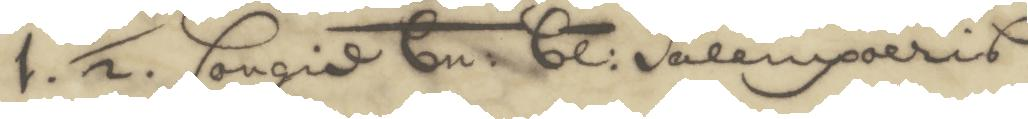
1. ½. Corgie br: bl: Salempoeris
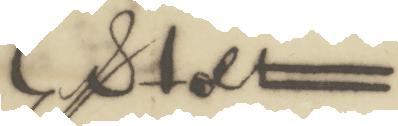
} vertolt
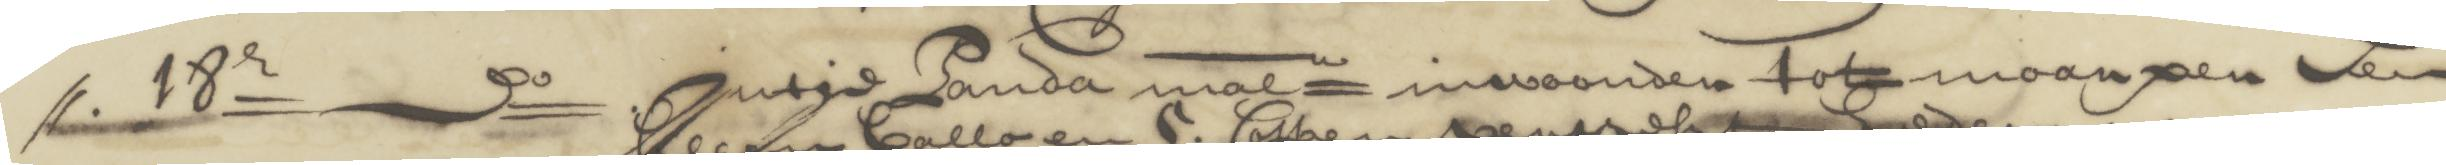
„. 18=en d=o Jntje Panda mal=e inwoonder tot moar per Een
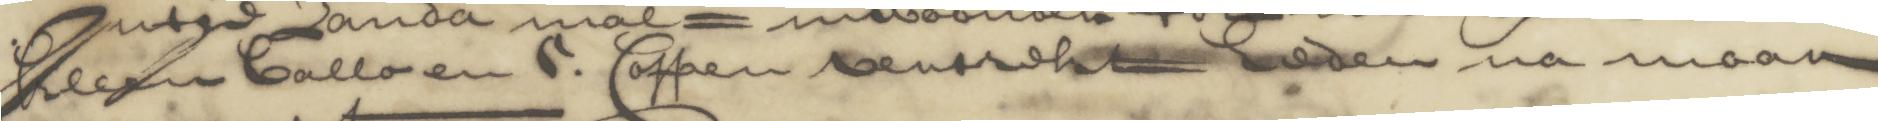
kleen ballo en 5. Coppen vertrekt heden na moar
